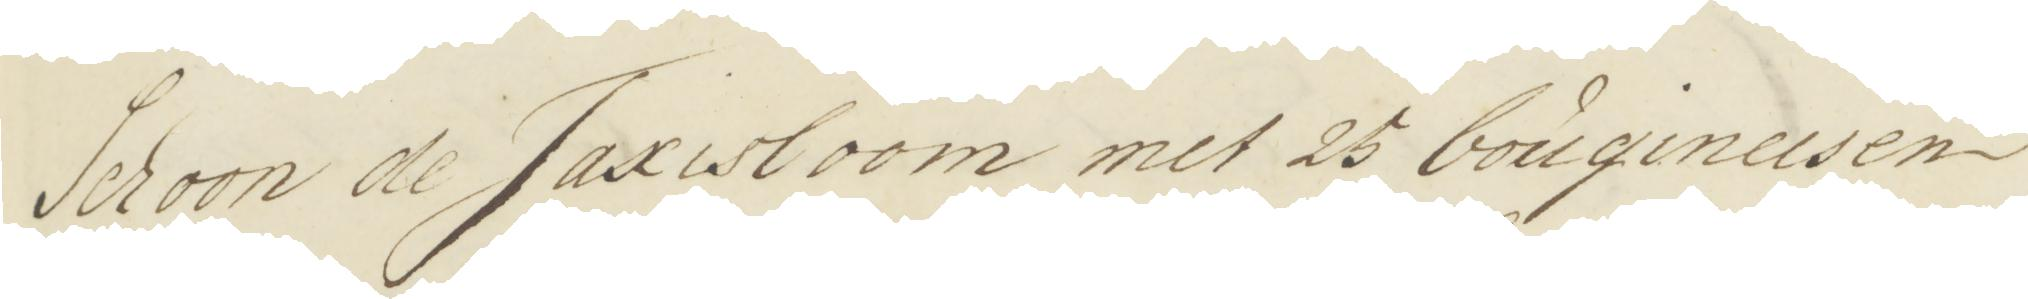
Schoon de Taxisboom met 25 bougineesen
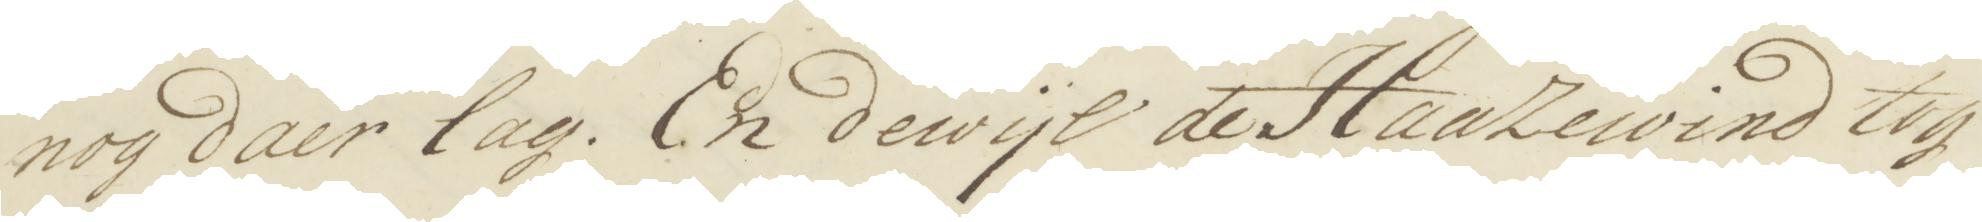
nog daer lag. En dewijl de Haazewind tog
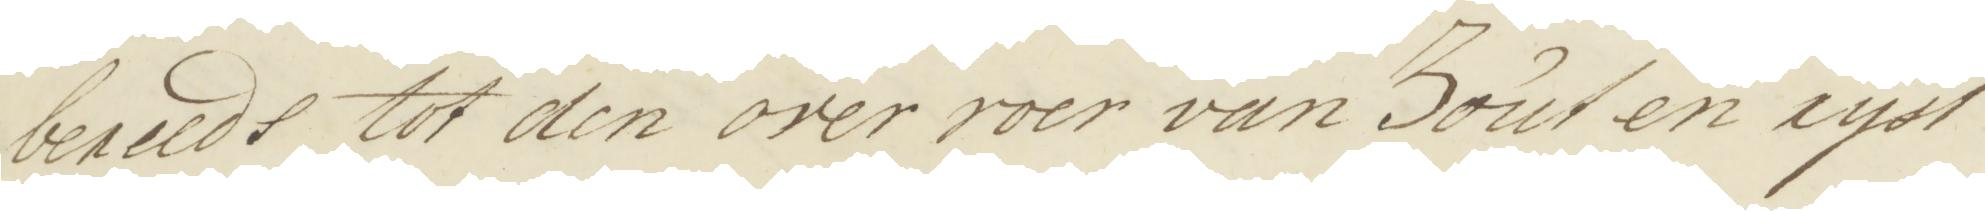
bereeds tot den over voer van Zout en rijst
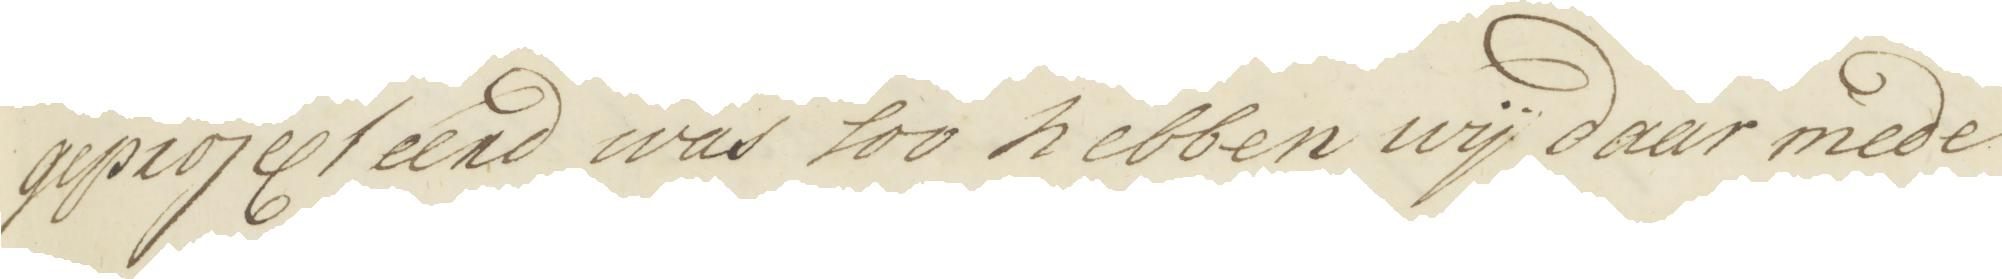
geprojecteerd was soo hebben wij daar mede
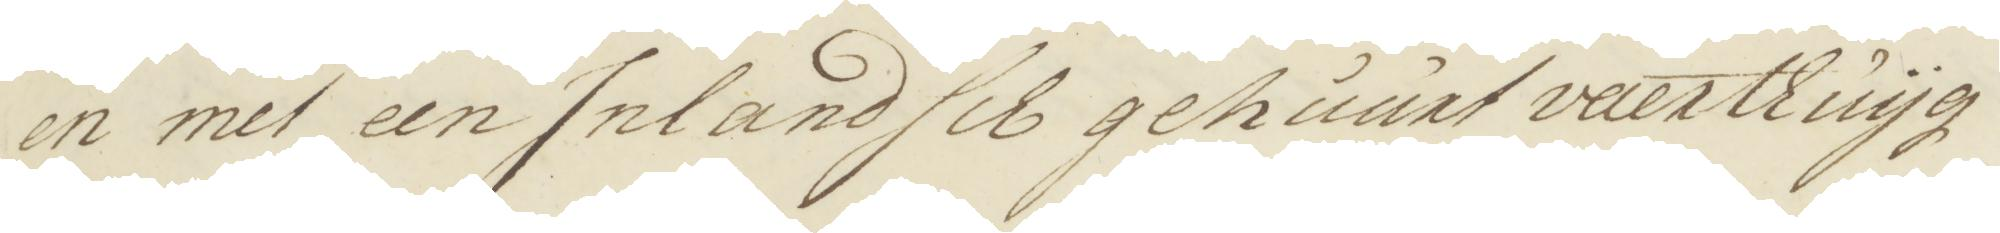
en met een Jnlandsch gehuurt vaerthuijg
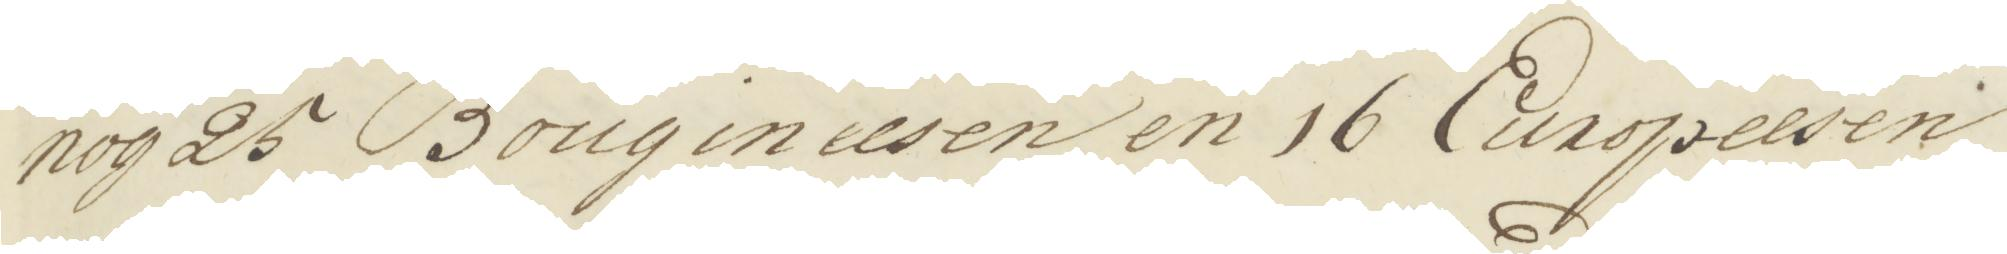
nog 25 Bougineesen en 16 Europeesen
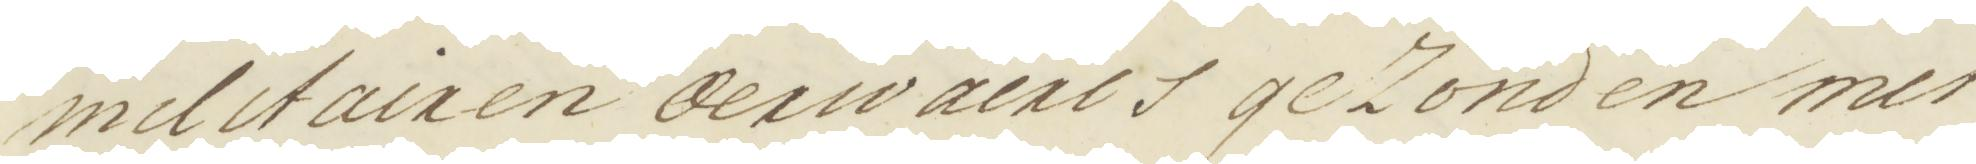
militairen derwaerds gezonden met
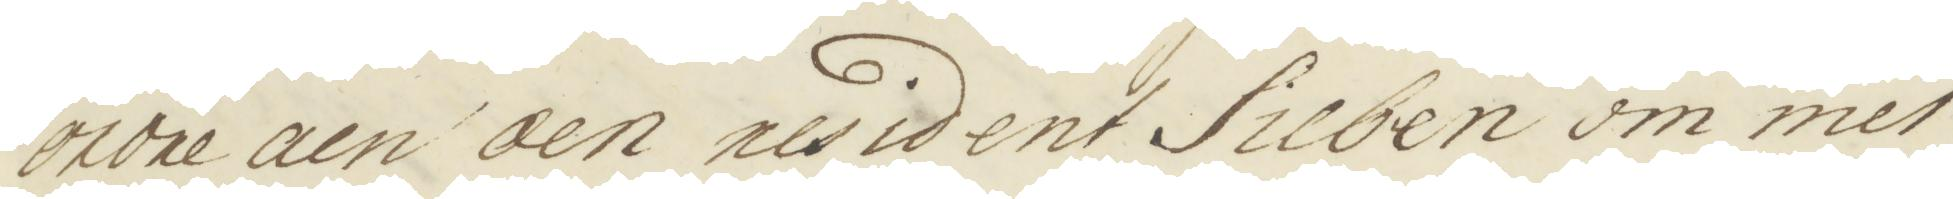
ordre aen den resident sieben om met
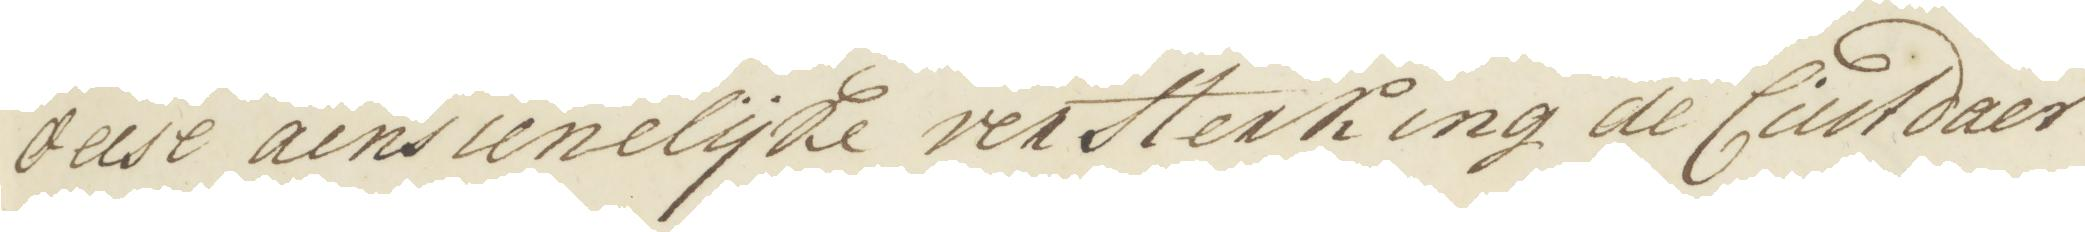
deese aensienelijke versterking de Cust daer
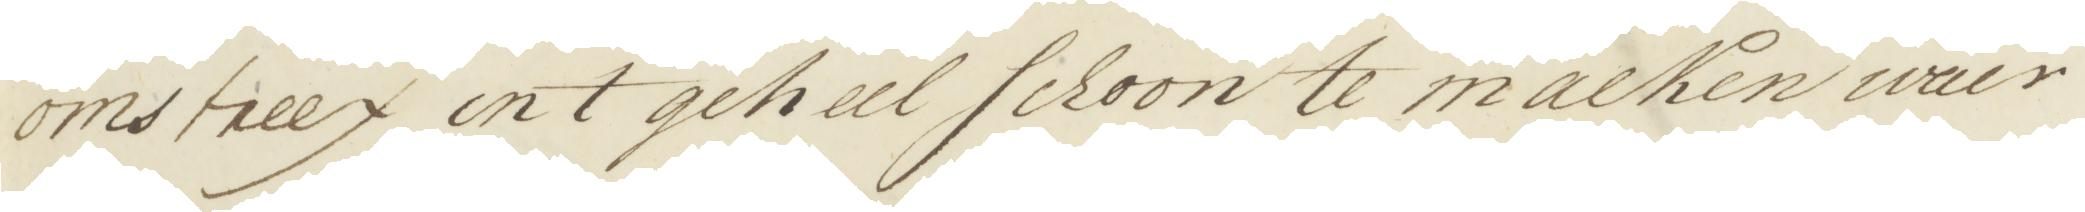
omstreex in t geheel schoon te maeken waer
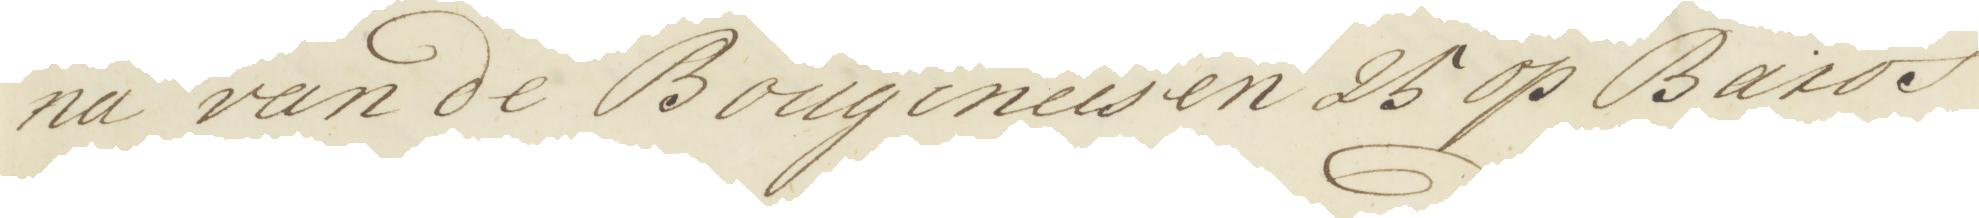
na van de Bougineesen 25 op Baros
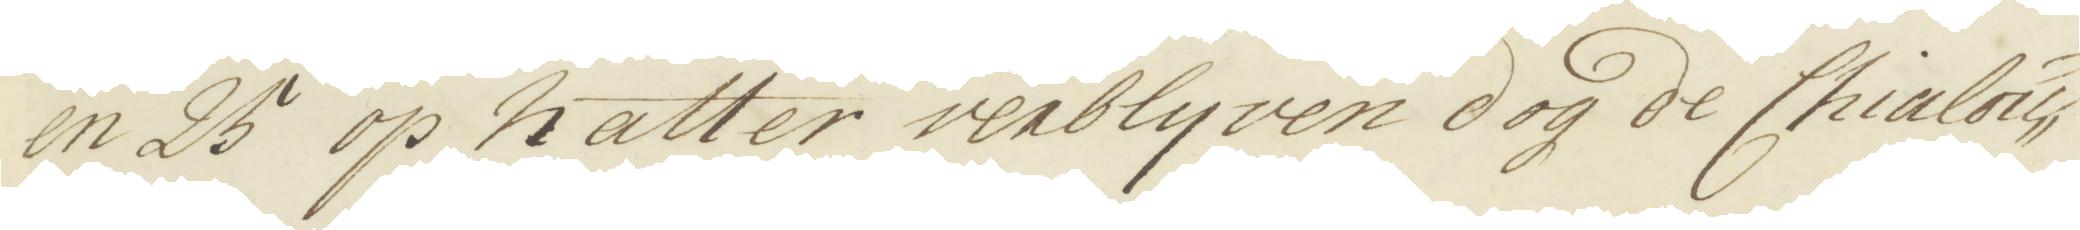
en 25 op natter verblyven dog de Chialou„
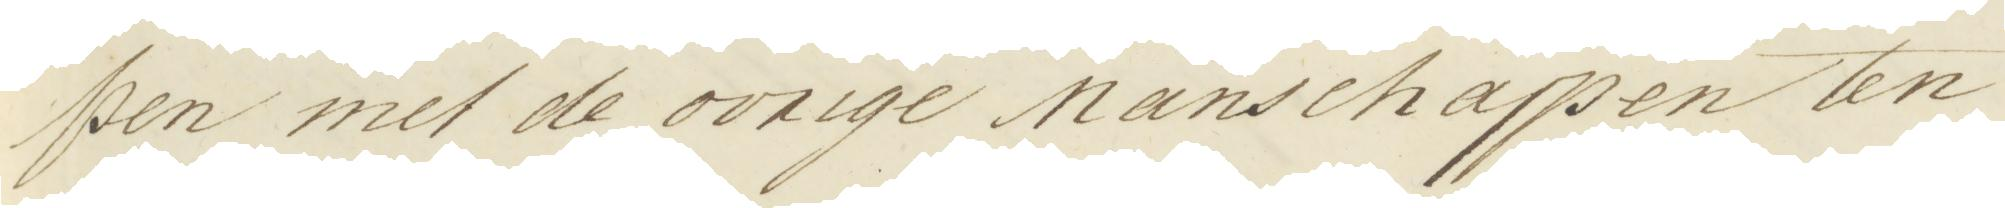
pen met de ovrige manschappen ten
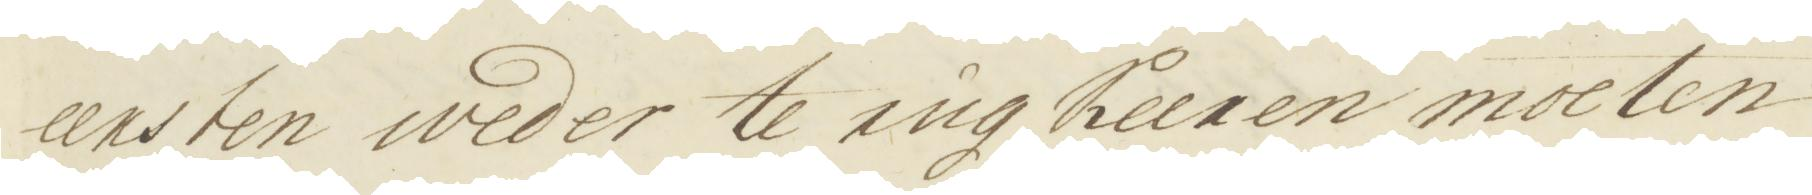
eersten weder te rug keeren moeten
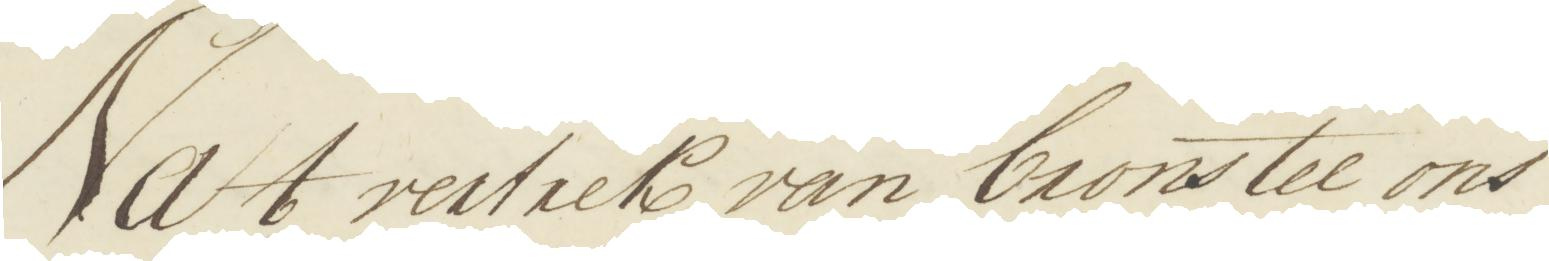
Na t vertrek van bronstee ons
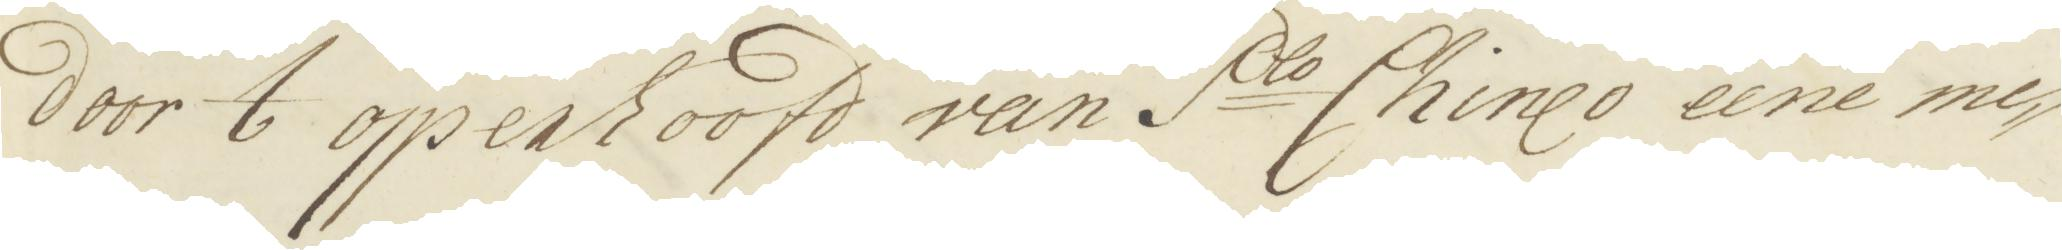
door t opperhoofd van P=lo Chinco eene me„
